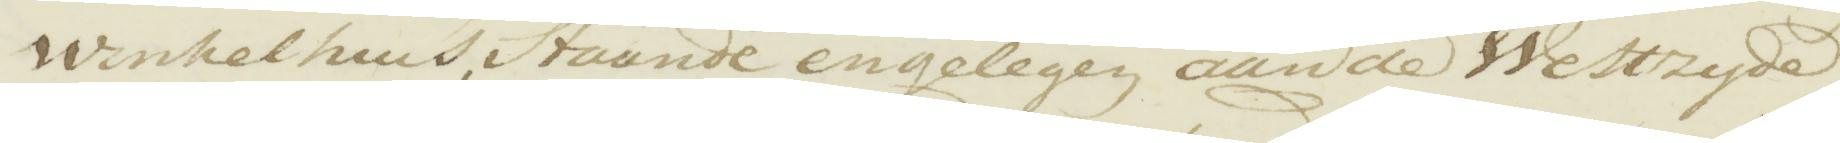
winkelhuis, staande en gelegen aan de Westzyde
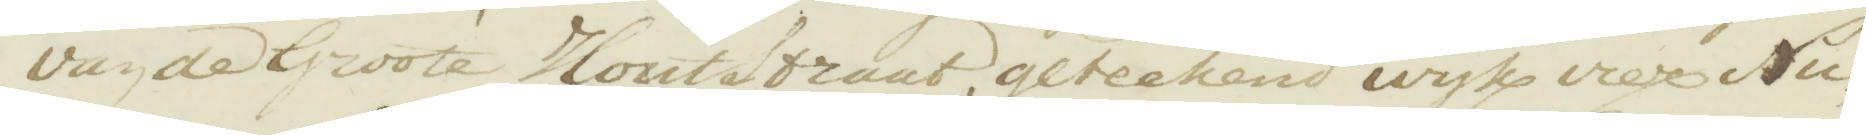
van de Groote Houtstraat, geteekend wyk vier Nu„
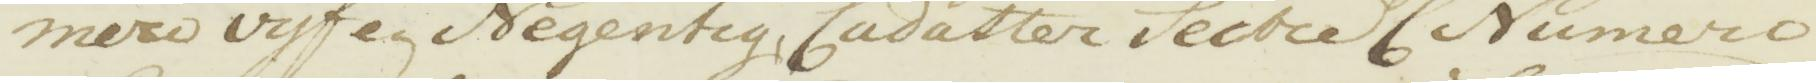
mero vyf en Negentig, Cadaster Sectie C Numero
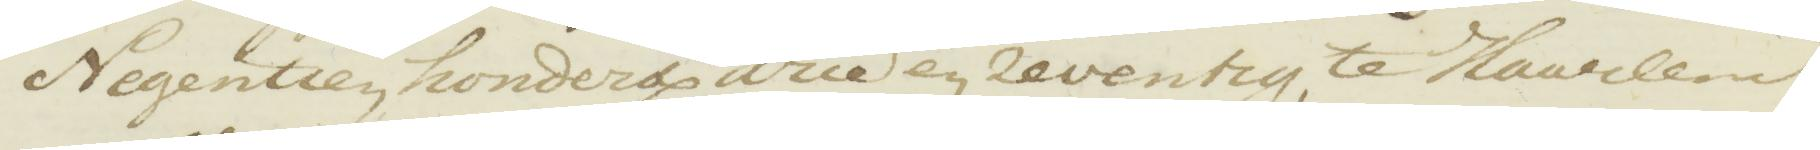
Negentien honderd drie en zeventig te Haarlem
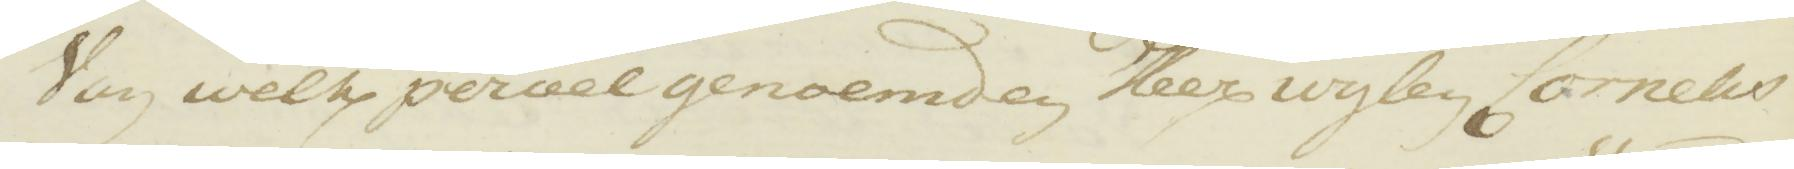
Van welk perceel genoemden Heer wylen Cornelis
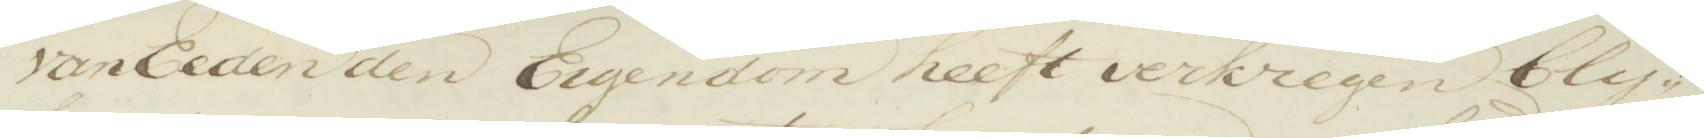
van Eeden den Eigendom heeft verkregen bly„
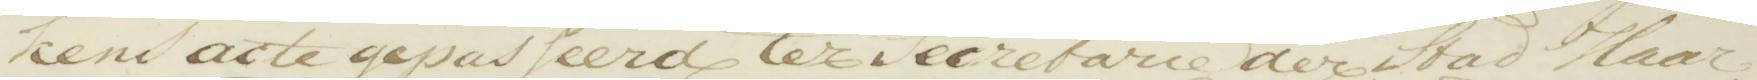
kens acte gepasseerd ter secretarie der stad Haar
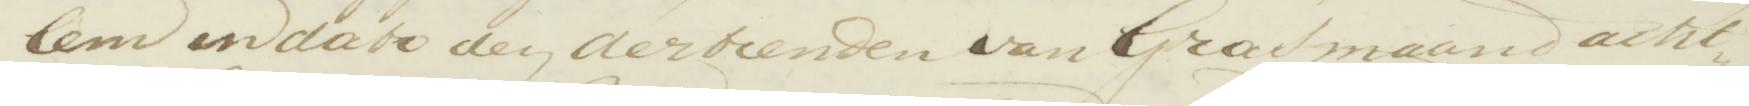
lem in dato den dertienden van Grasmaand acht„
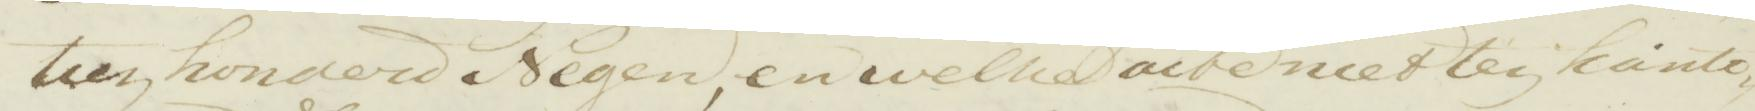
tien honderd Negen, en welke acte niet ten kanto
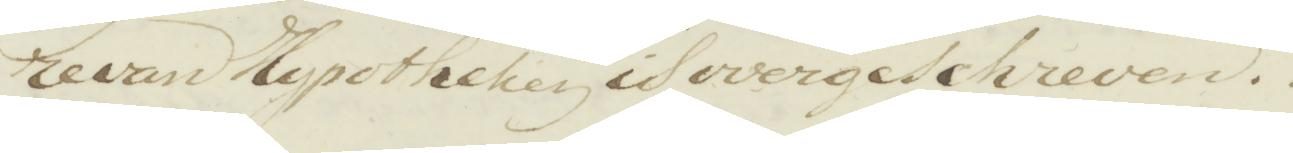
re van Hypotheken is overgeschreven.
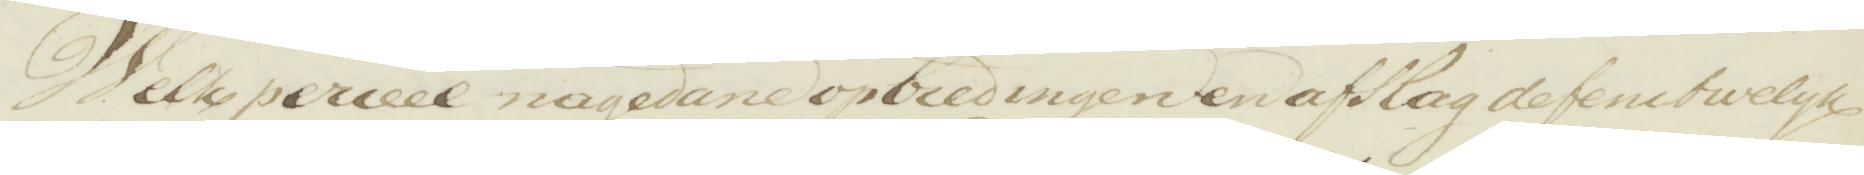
Welk perceel nagedane opbiedingen en afslag defenitivelyk
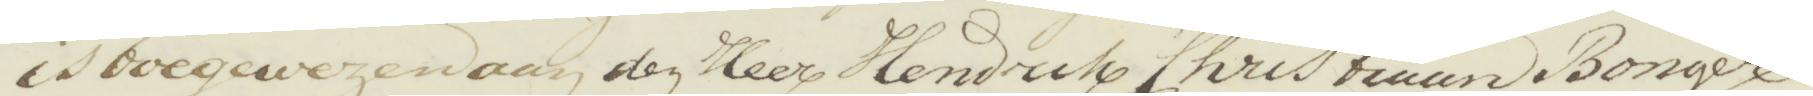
is toegewezen aan den Heer Hendrik Christiaan Bonger
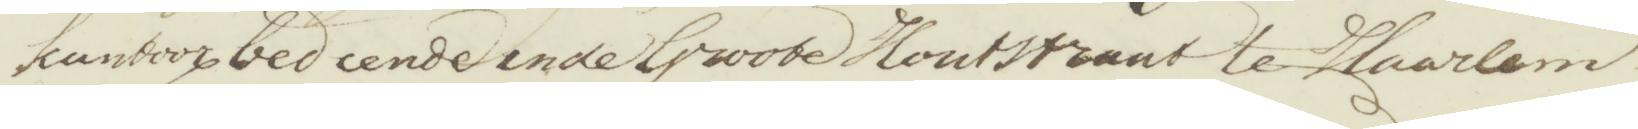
kantoor bediende in de Groote Houtstraat te Haarlem
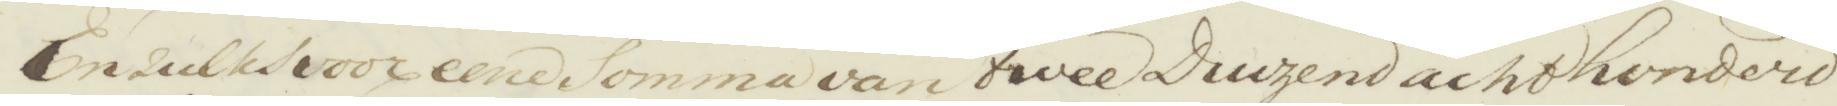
En zulks voor eene somma van twee Duizend acht honderd
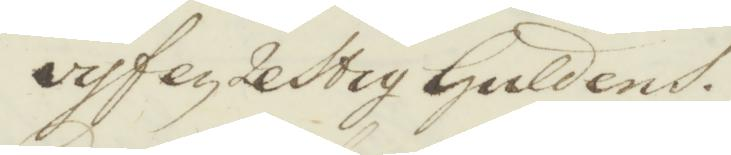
vyf en zestig Guldens.
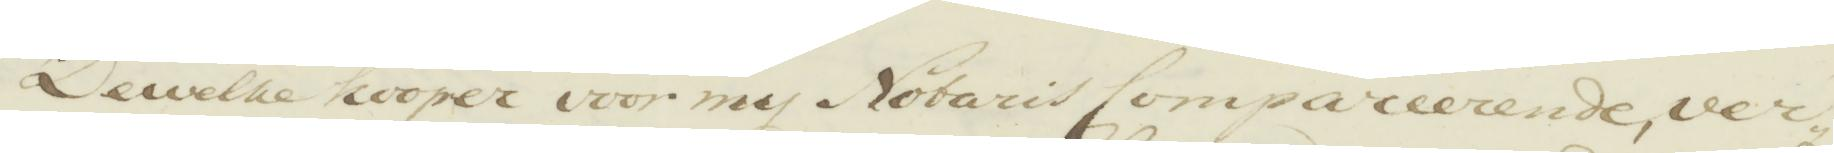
Dewelke kooper voor my Notaris Compareerende, ver„
